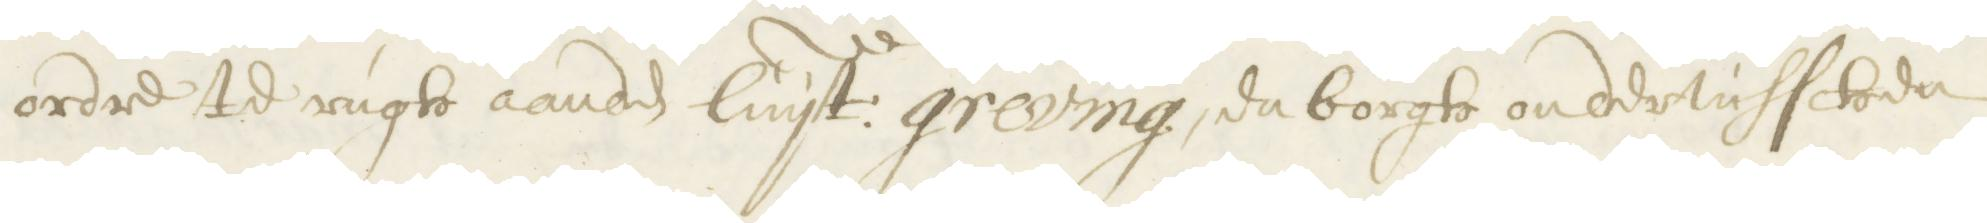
ordre te rugh aanden luijt: greving, en borgh ondertusschen
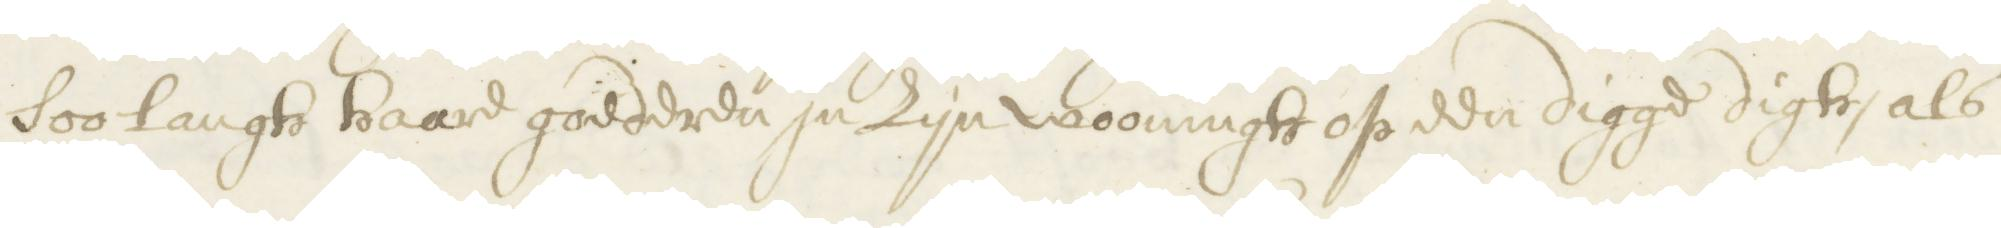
soo langh haare goederen jn zijn wooningh op een digge digh, als
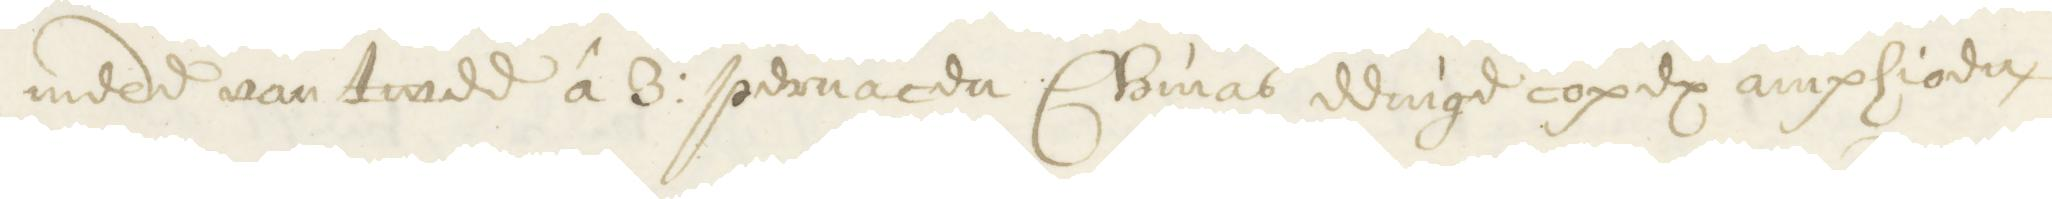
mede van twee â 3: pernacen Chinas eenige copex amphioen,
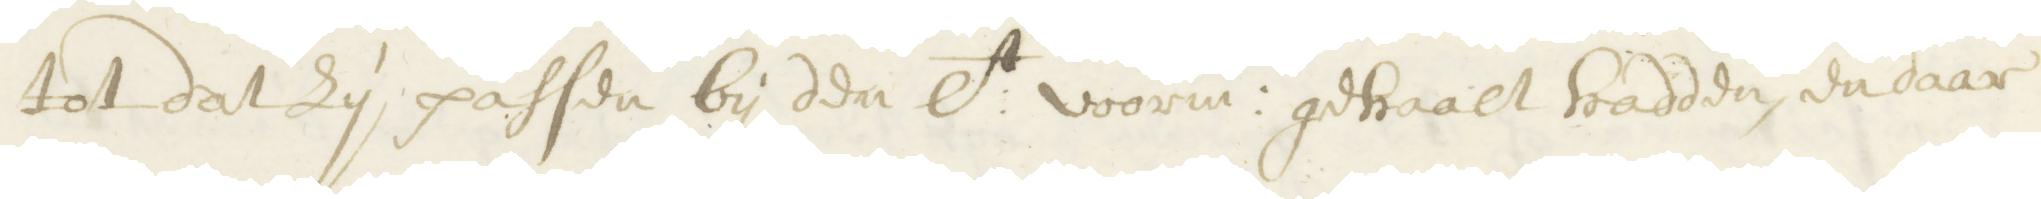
tot dat zij passen bij den e:t voorm:t gehaalt hadden, en daar
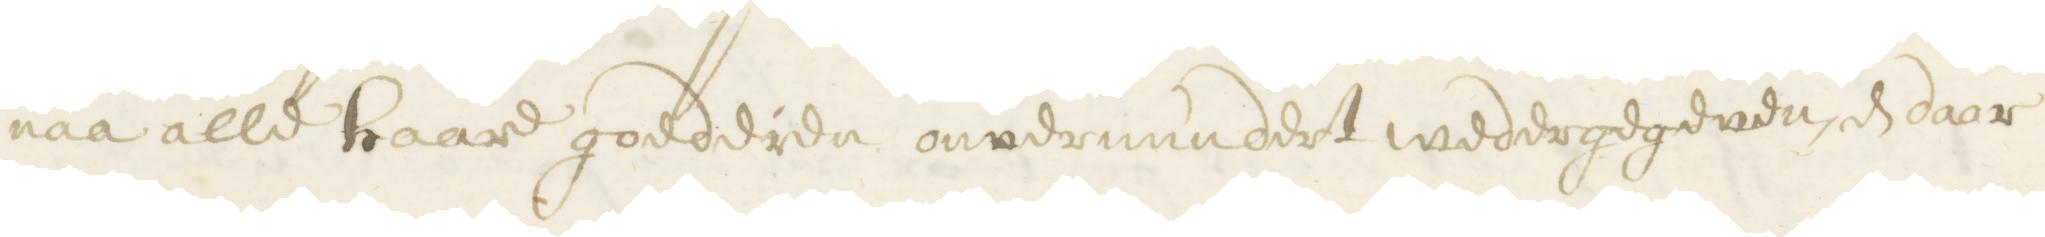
naa alle haar goederen onvermindert wedergegeven, en daar
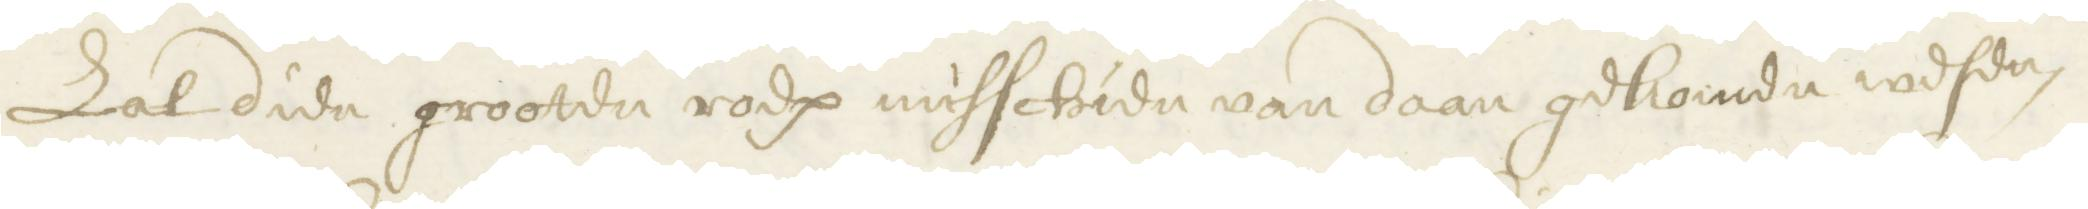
zal dien grooten roep misschien van daan gekomen wesen,
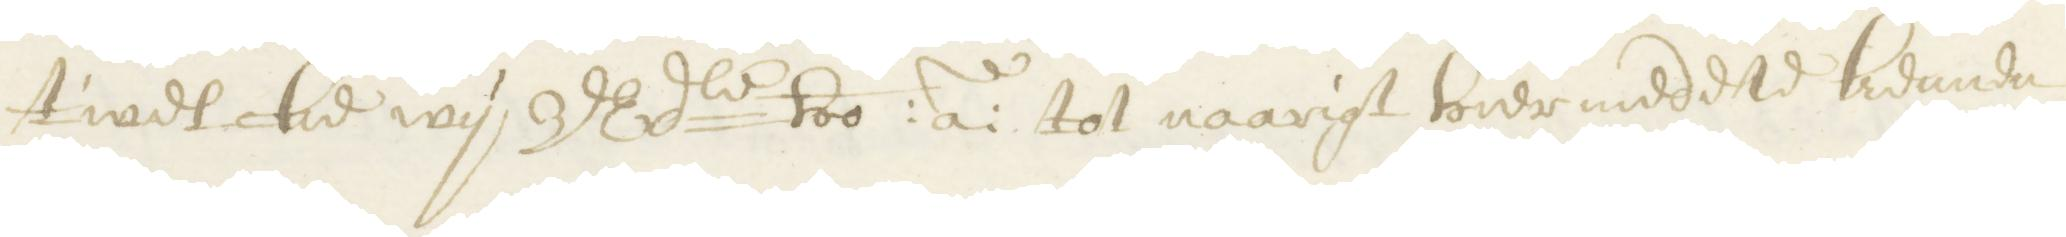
t'welcke wij VEd=le ho: a: tot naarigt hier mede te kennen
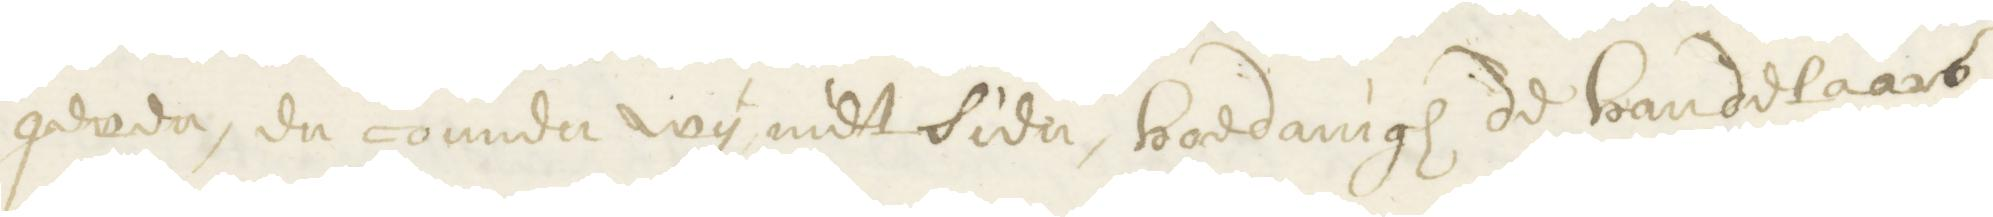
geven, en connen wij niet sien, hoedanigh de handelaars
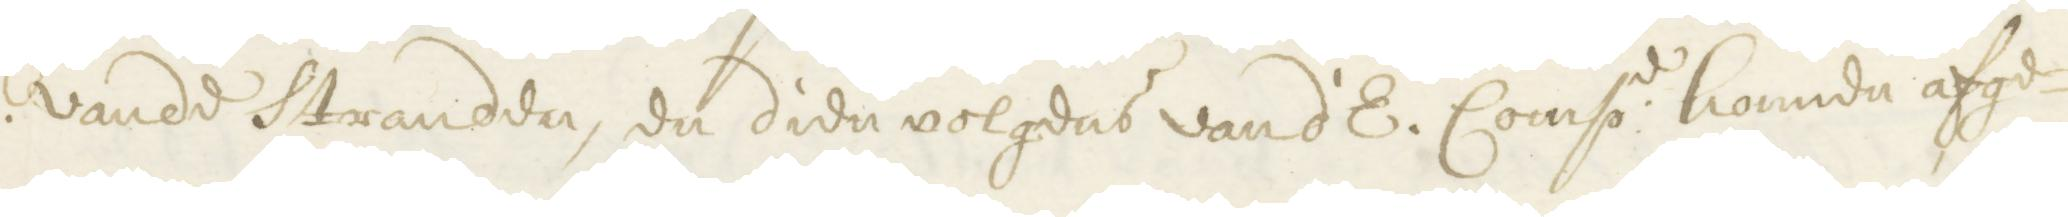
vande stranden, en dien volgens van d’E. Comp:e konnen afge
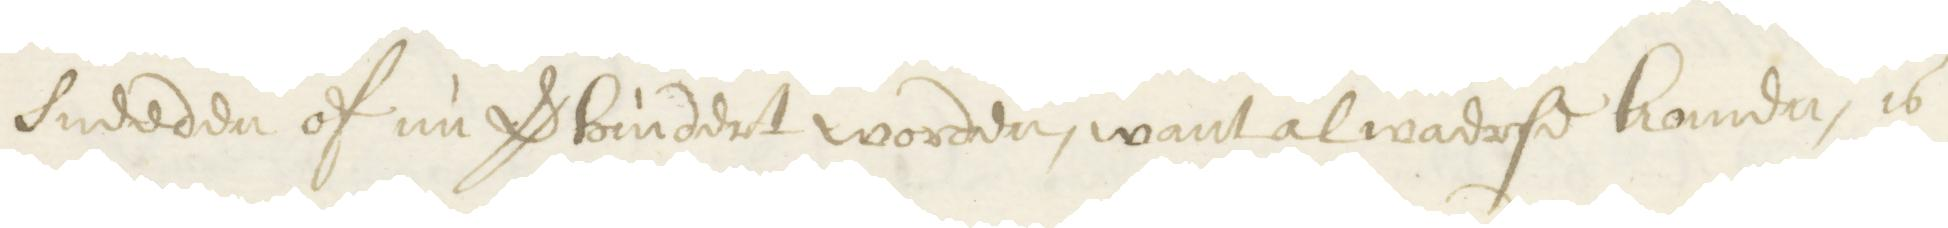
sneeden of nu verhindert worden, want alwaerse komen, is
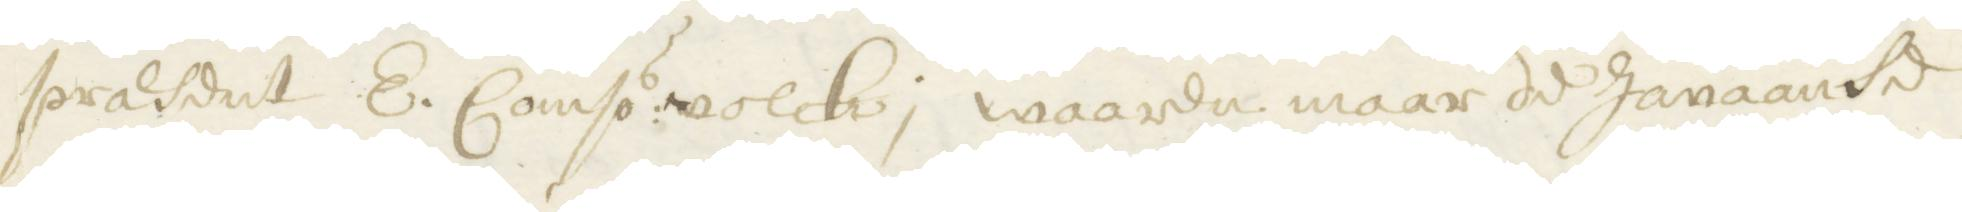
praesent E. Comp:s volck; waaren maar de Javaanse
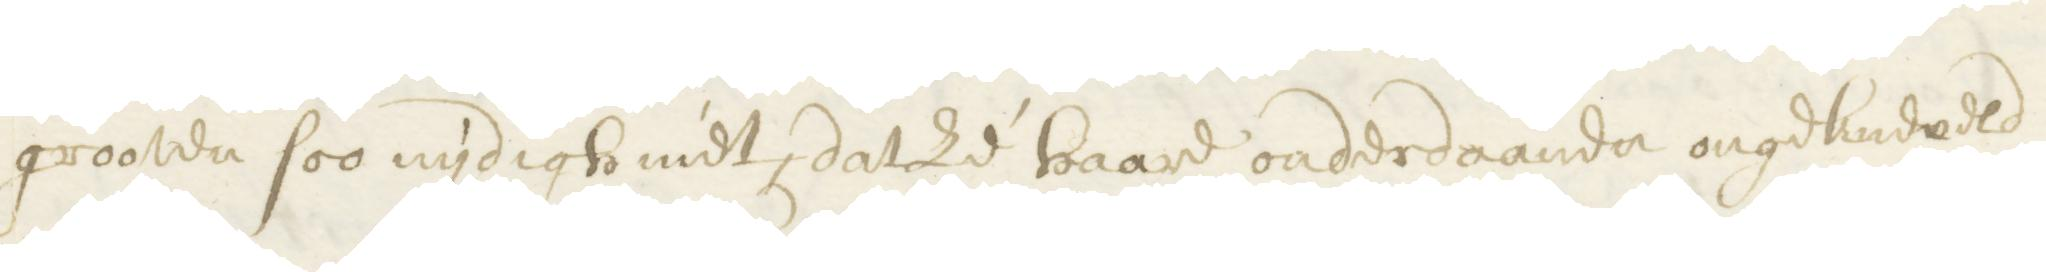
grooten soo nijdigh niet, dat ze' haare onderdaanen ongekneveld
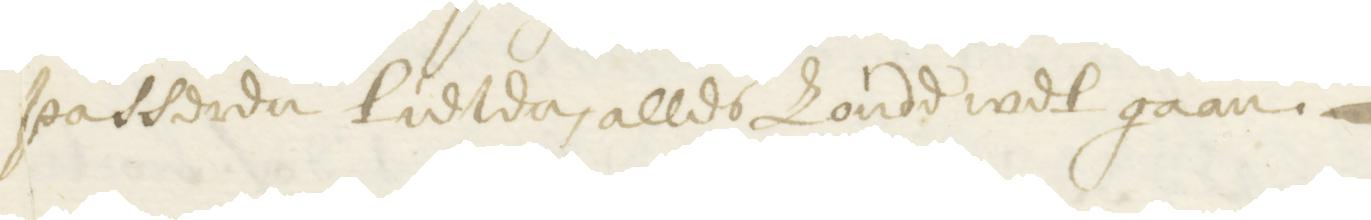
passeren lieten, alles zoude wel gaan.
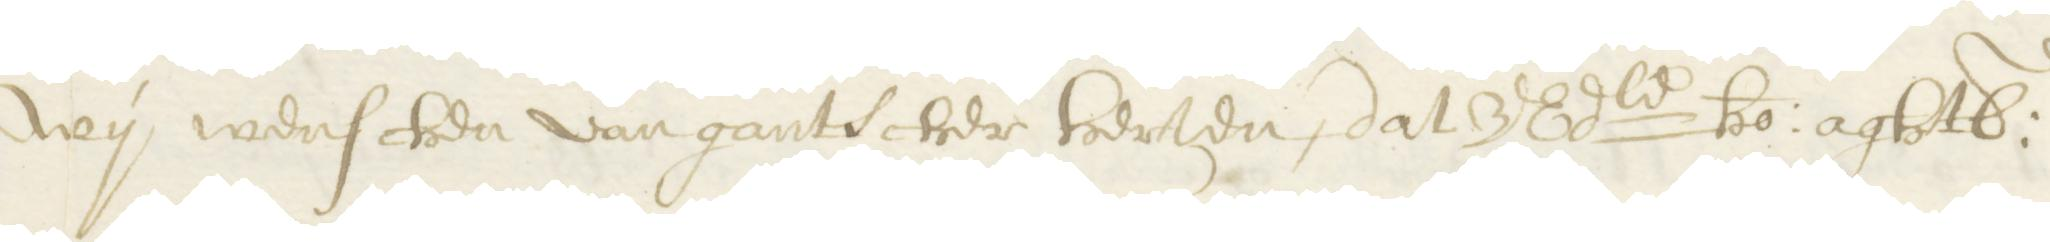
wij wenschen van gantscher herten, dat VEd=le ho: agtb:
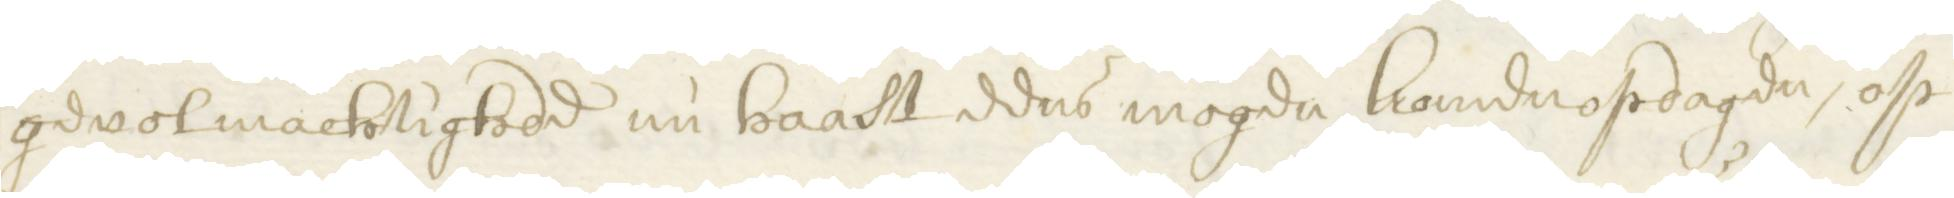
gevolmachtighde nu haast eens mogen komen opdagen, op
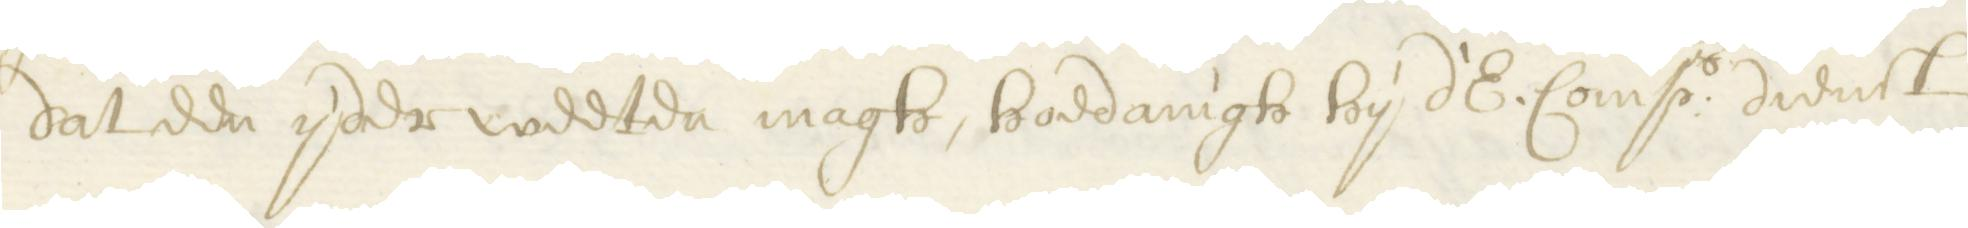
dat een ijder weeten magh, hoedanigh hij d’E.Comp:s dienst
